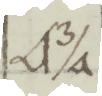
4¾
